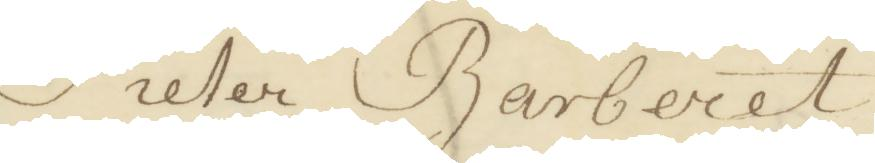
Pieter Barberet
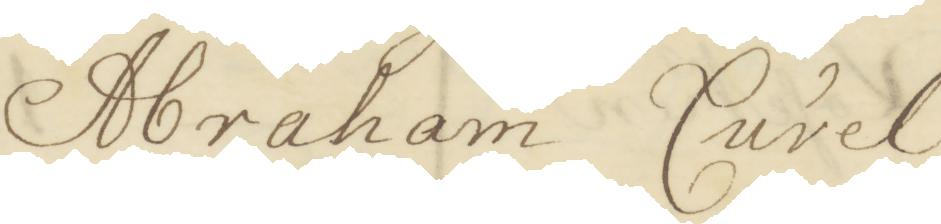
Abraham Cuvel
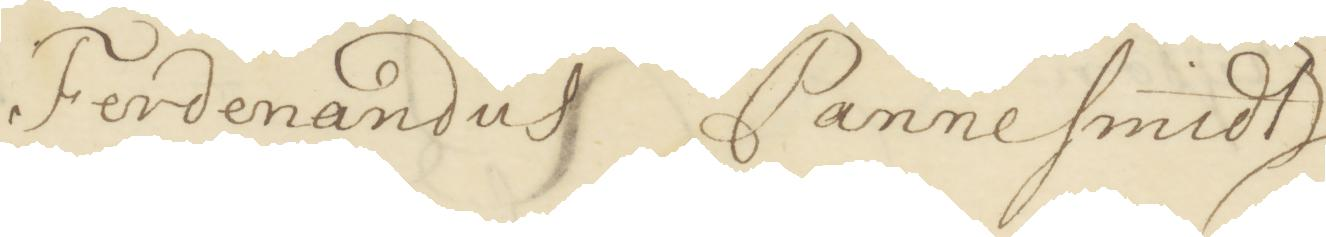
Ferdenandus Pannesmidt
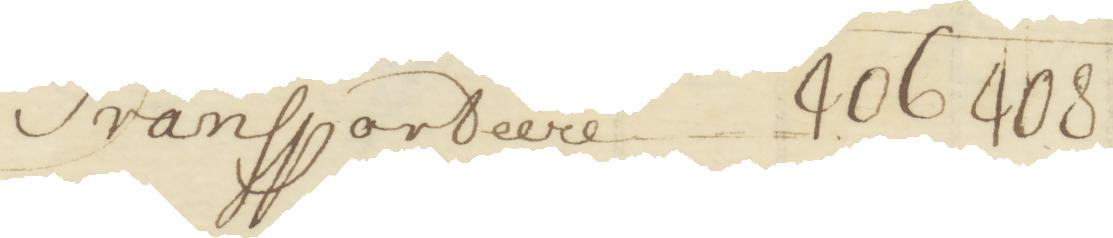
Transporteere 406 408
